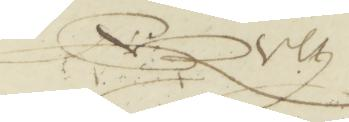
No vlg
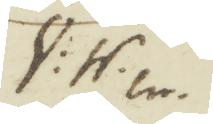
V: W ln.
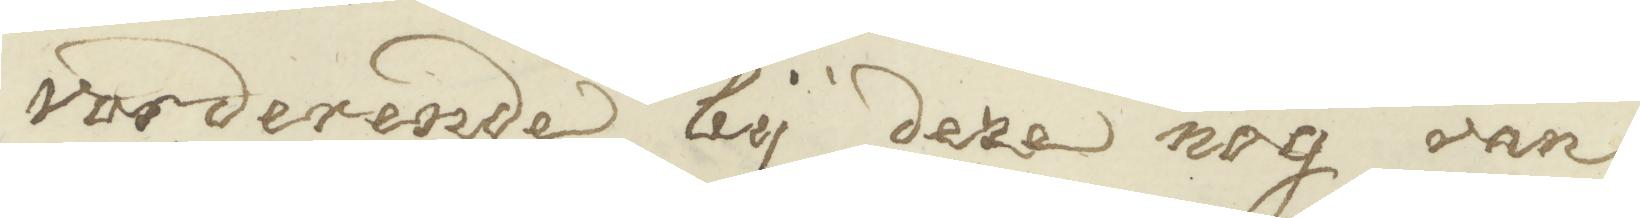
vorderende bij deze nog van
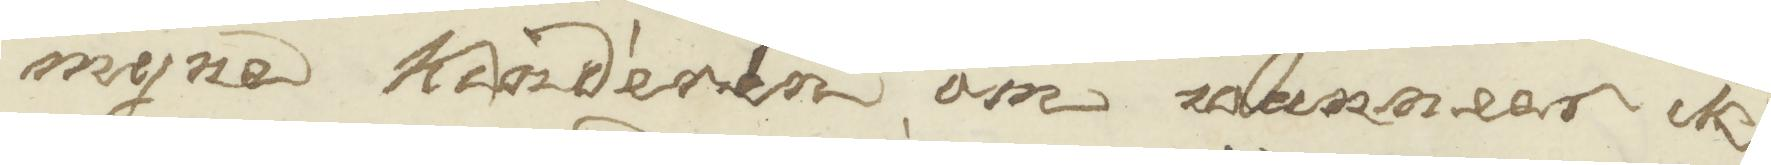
mijne kinderen om wanneer ik
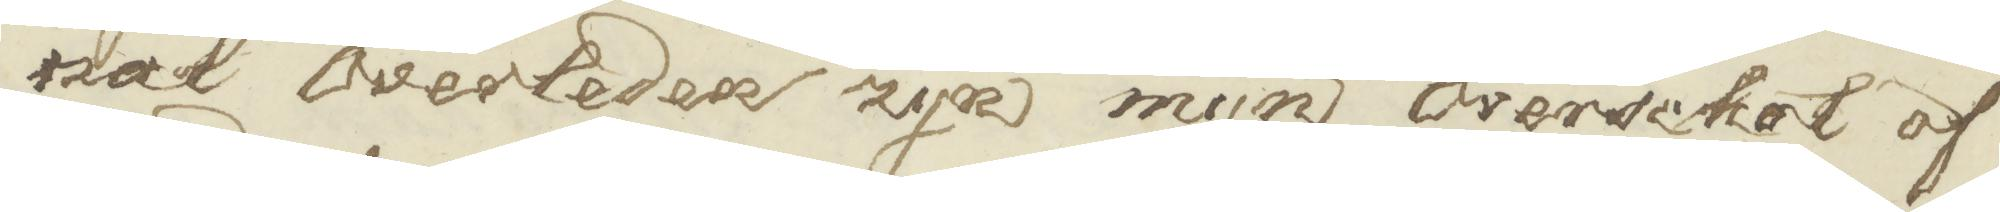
zal overleden zijn mijn overschot of
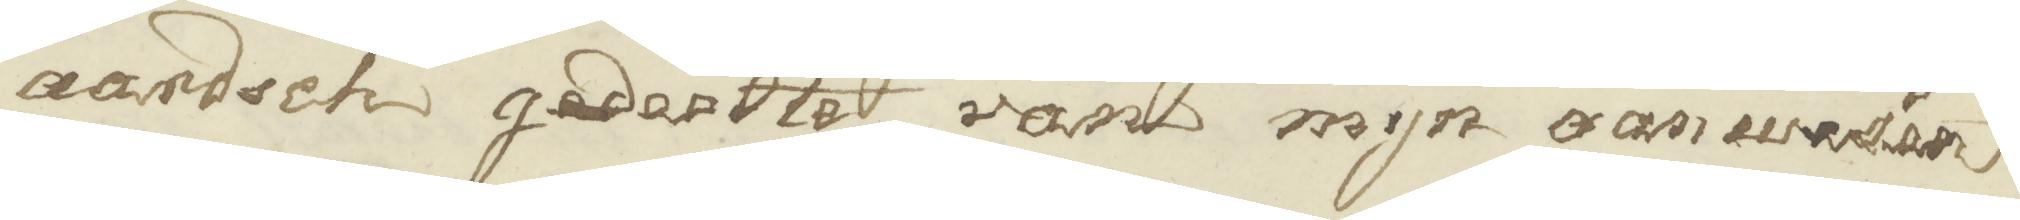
aardsch gedeelte van mijn aanwezen
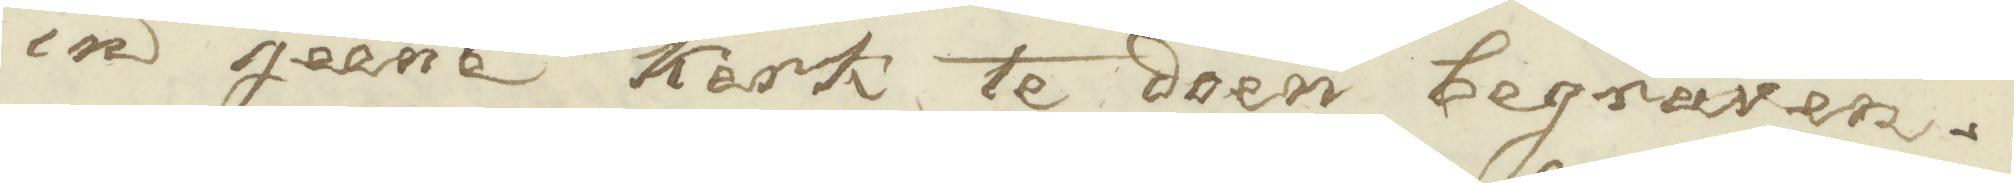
in geene kerk te doen begraven -
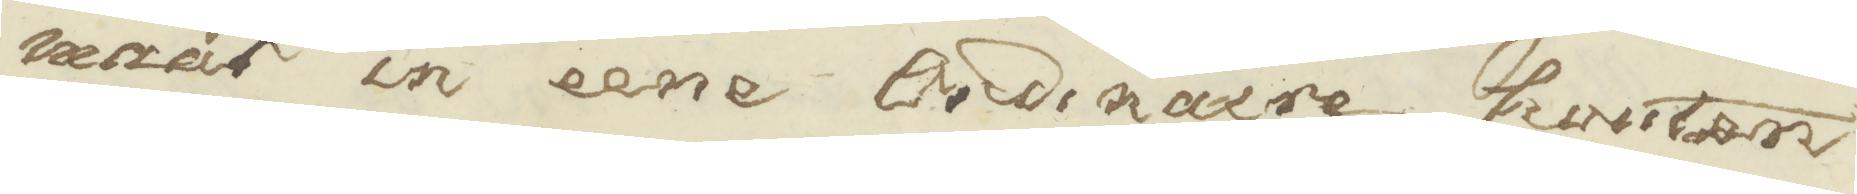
maar in eene Ordinaire houten
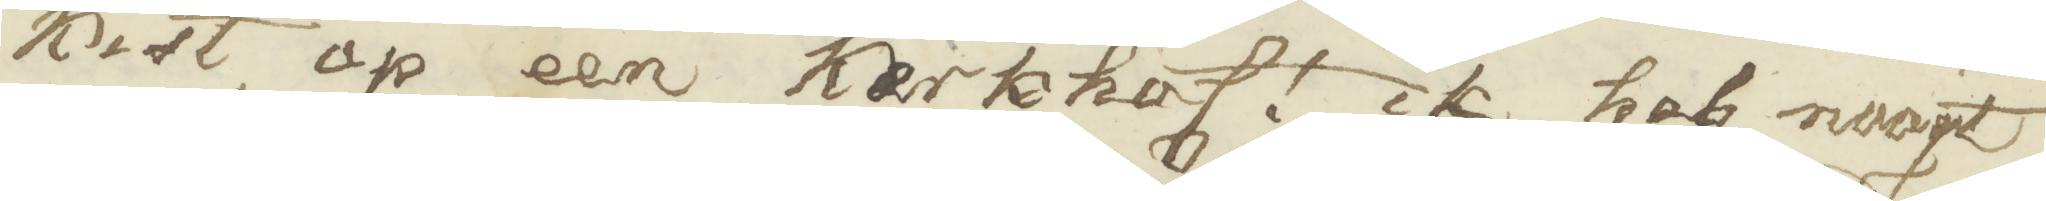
kist, op een kerkhof.t ik heb nooijt
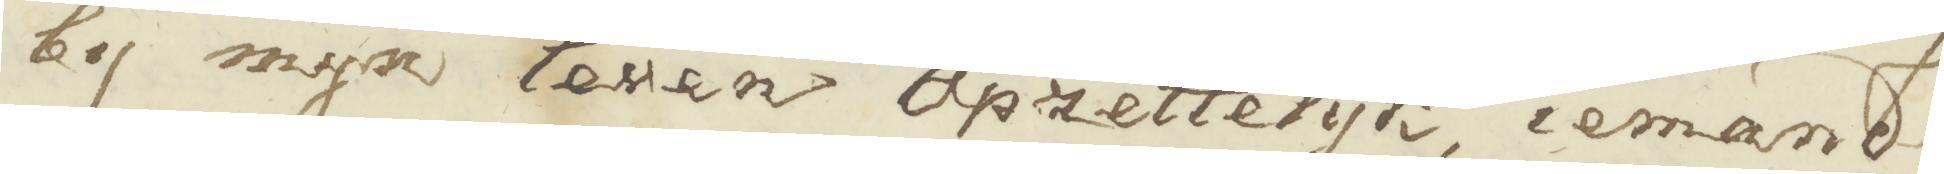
bij mijn leven opzettelijk, iemand
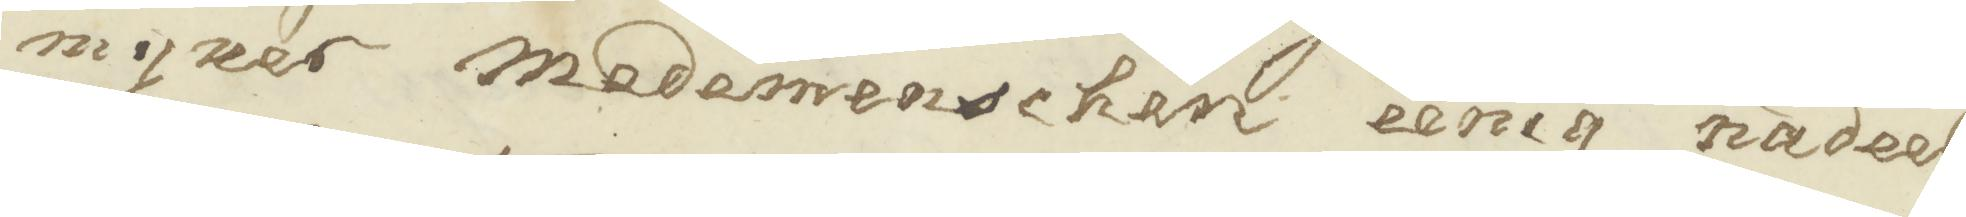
myner medemenschen eenig nadeel
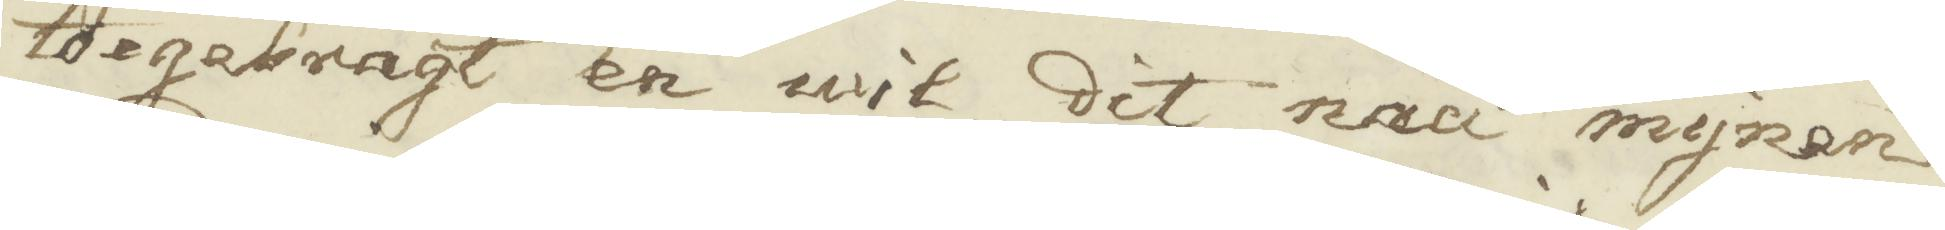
toegebragt en wil dit naa mijnen
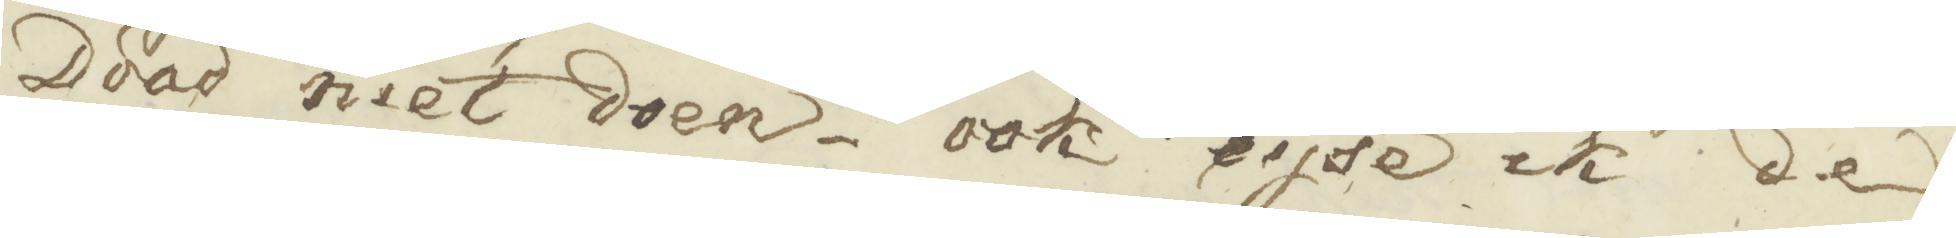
Dood niet doen - ook eijse ik de
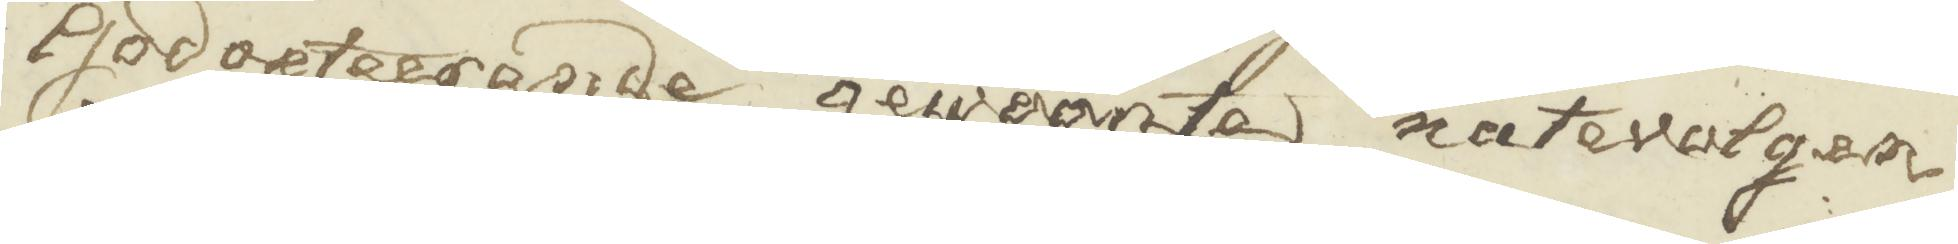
Godorteerende gewoonte natevolgen
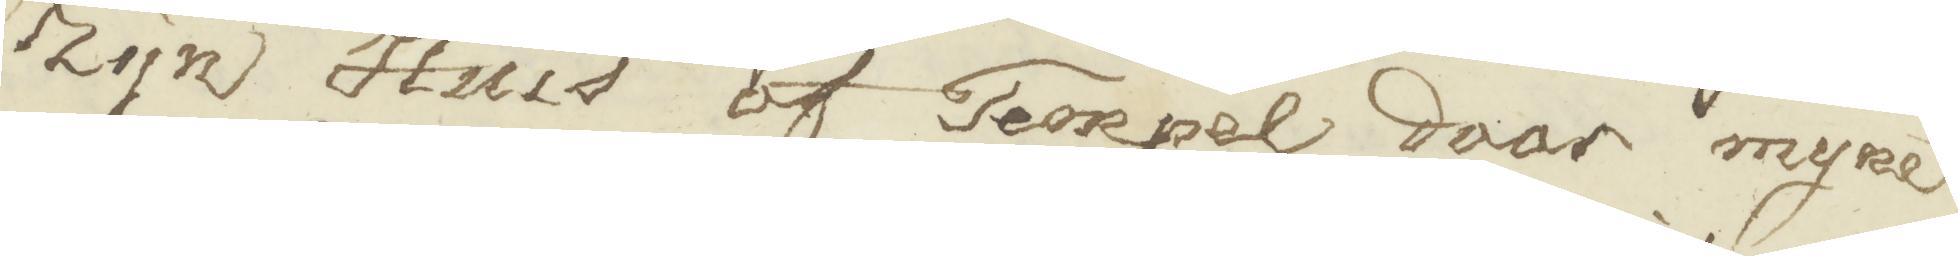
zijn Huis of Tempel door myne
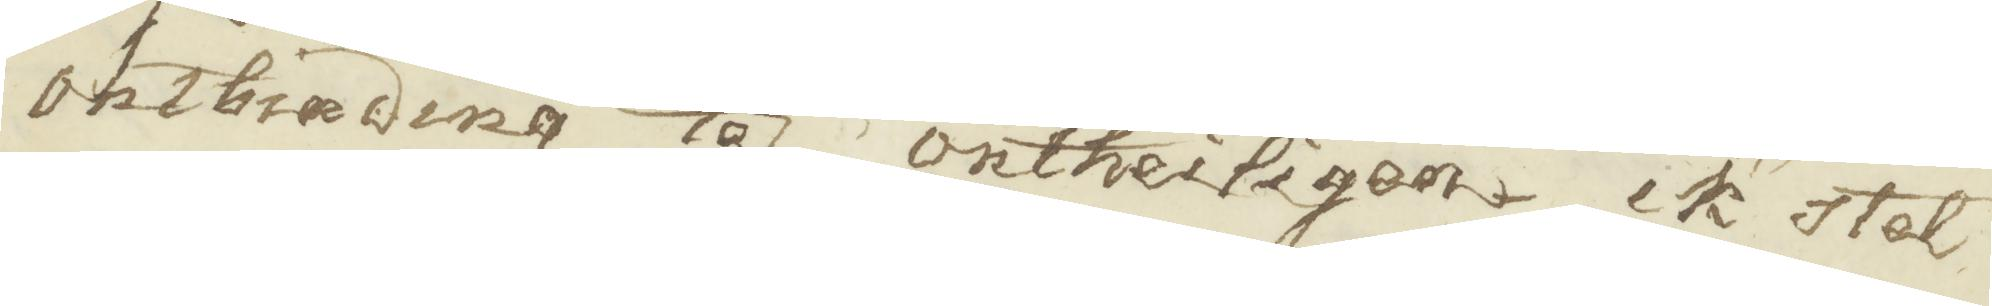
ontbieding te ontheiligen - ik stel
